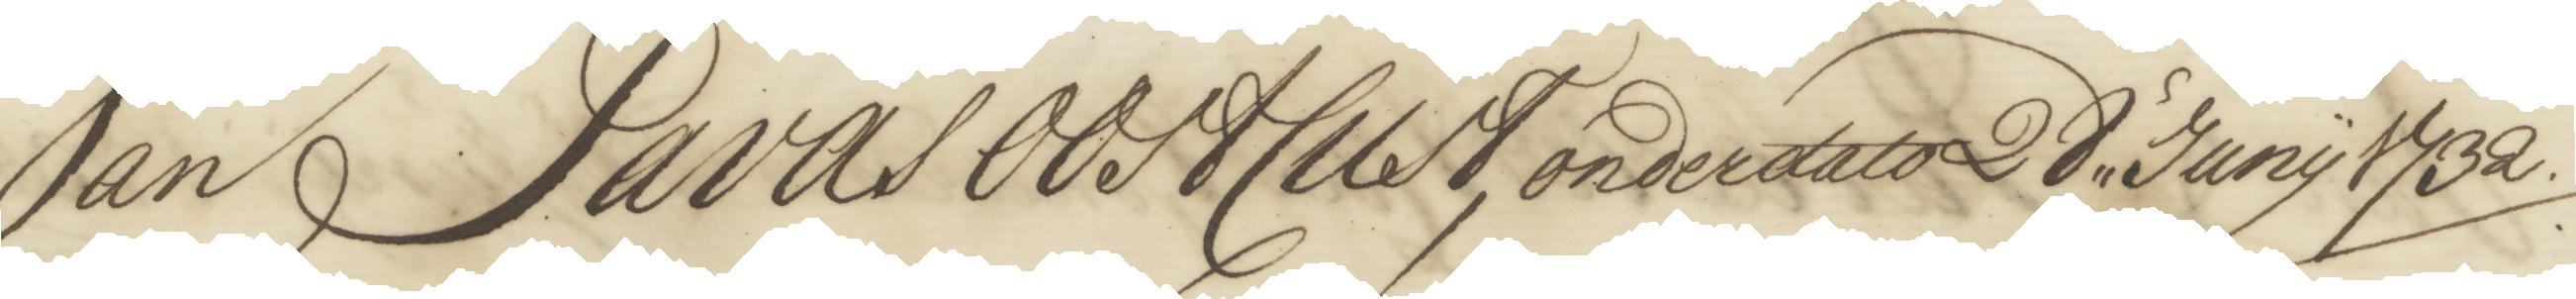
Van Iavas oostCust, onderdato 28„' Iunij 1732.
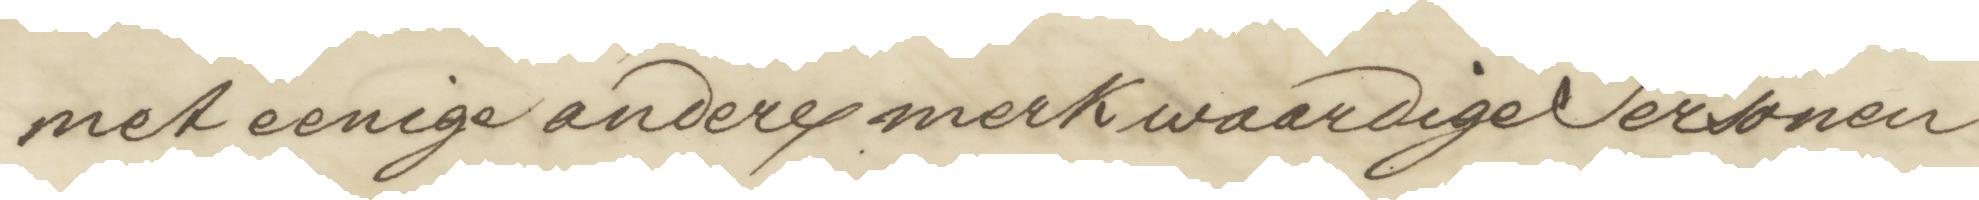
met eenige andere merkwaardige Personen
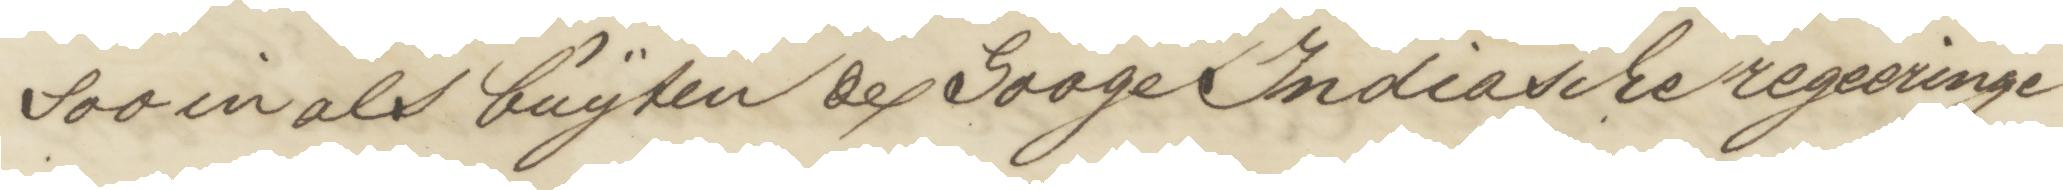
soo in als buijten de hooge Indiasche regeeringe
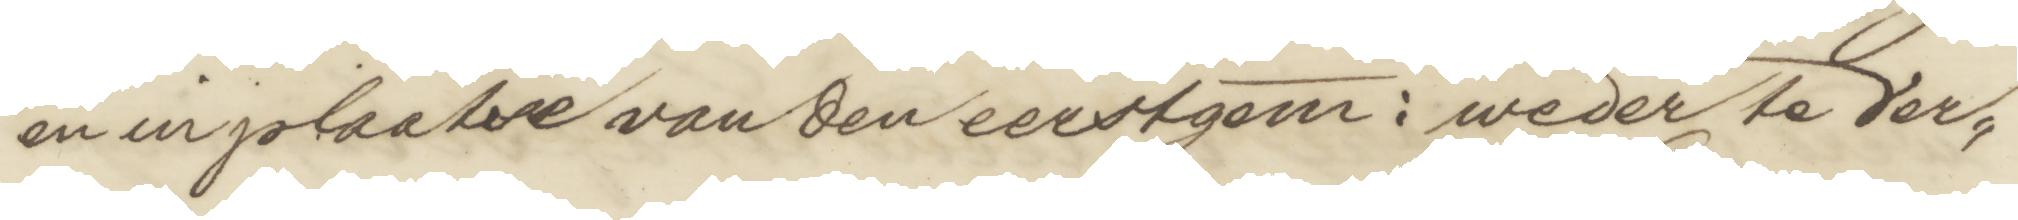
en in plaatse van den eerstgem: weder te ver„
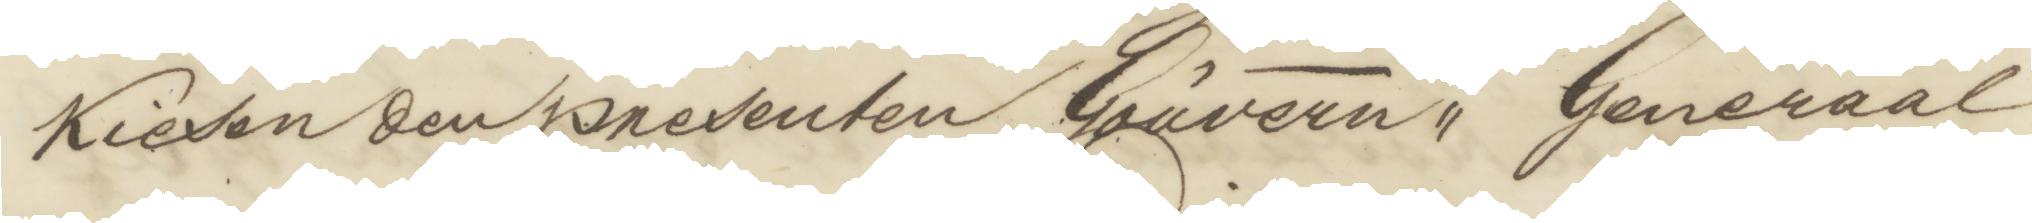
kiesen den presenten Gouvern„r Generaal
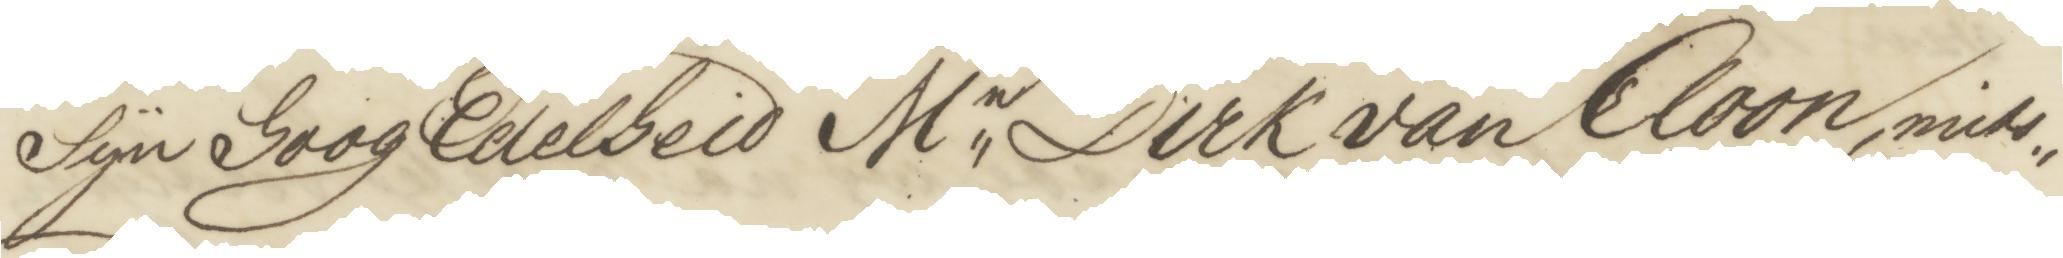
sijn hoog Edelheid M„r Dirk van Cloon, mits„
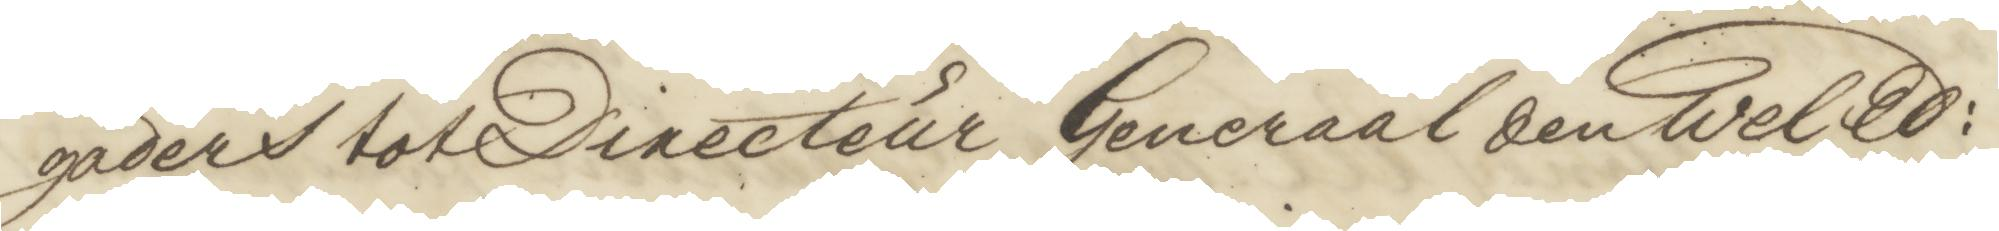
gaders tot Directeur Generaal den wel Ed:
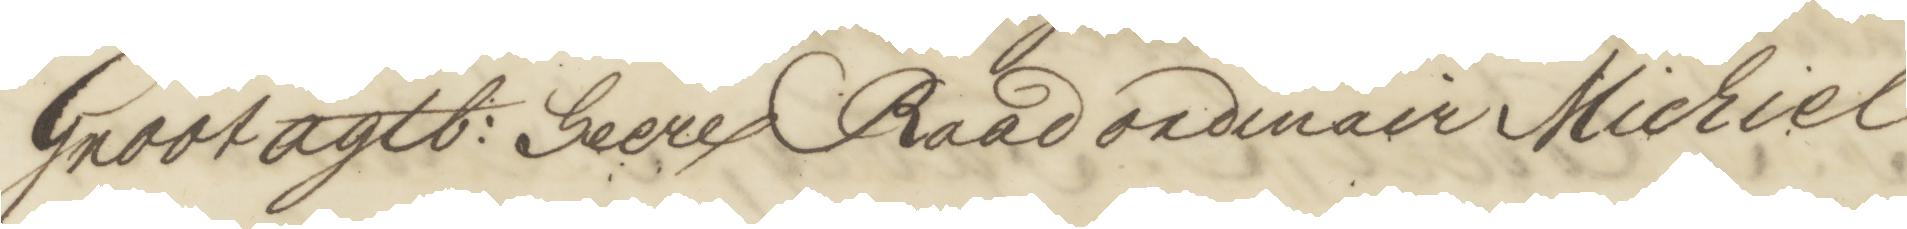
Groot agtb: heere Raad ordinair Michiel
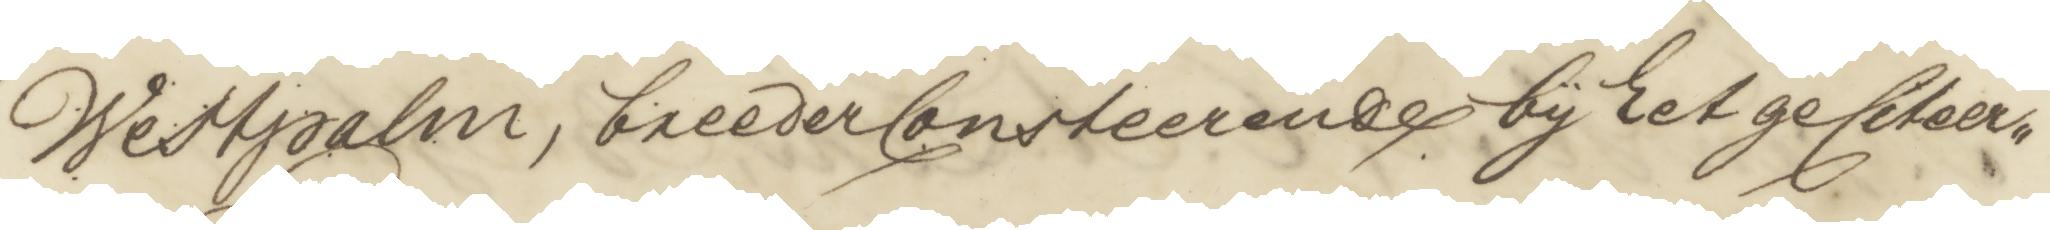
Westpalm, breeder consteerende bij het geciteer„
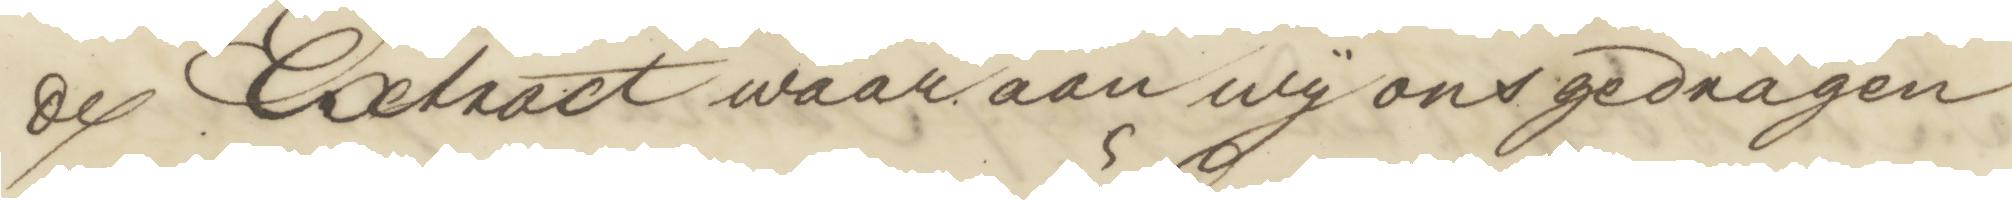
de Extract waar aan wij ons gedragen
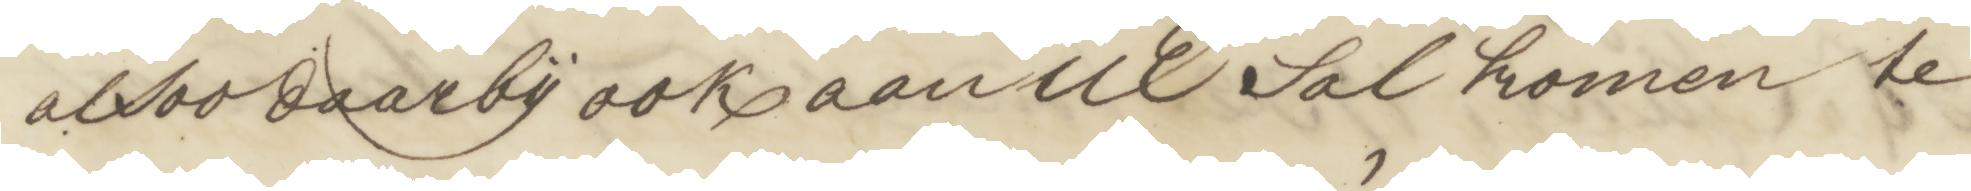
alsoo daarbij ook aan UE sal komen te
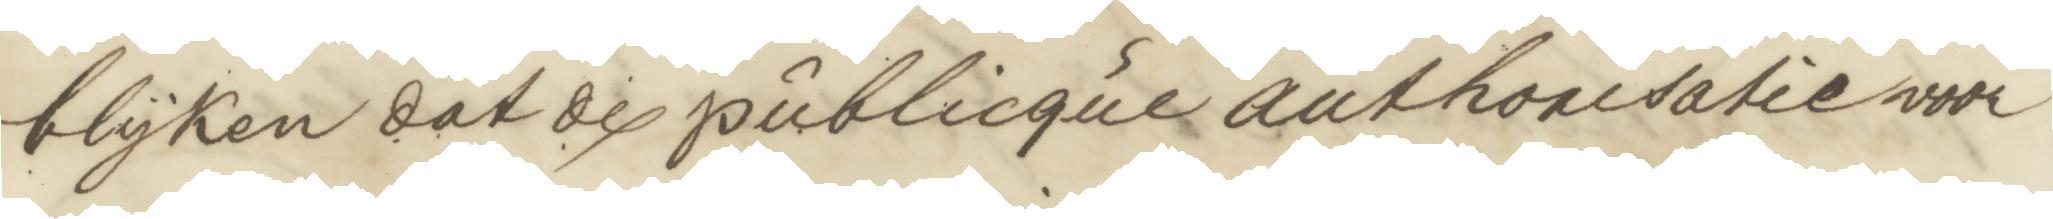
blijken dat de publicque authorisatie voor
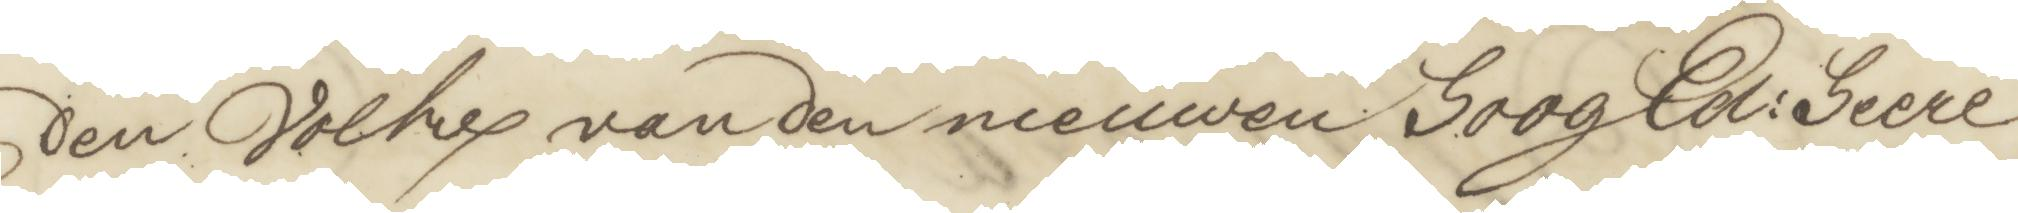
den volke van den nieuwen hoog Ed: heere
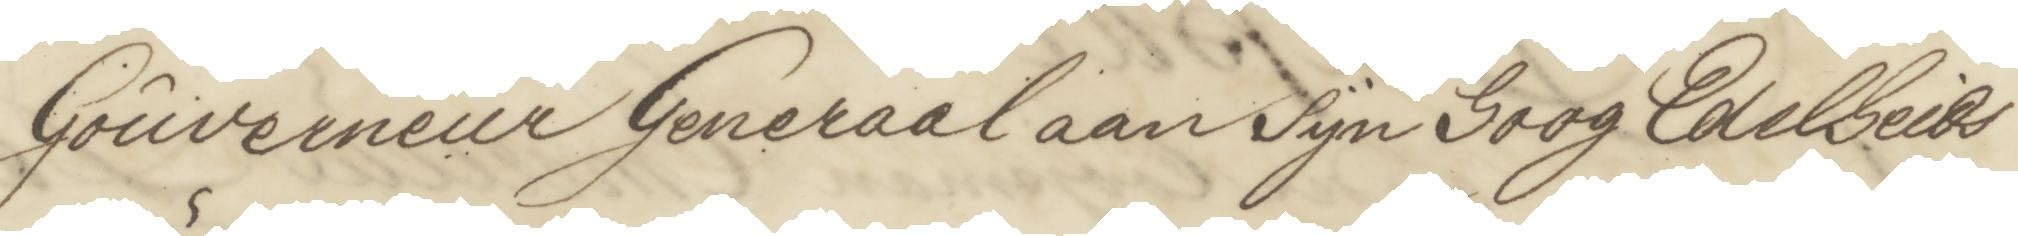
Gouverneur Generaal aan sijn hoog Edelheids
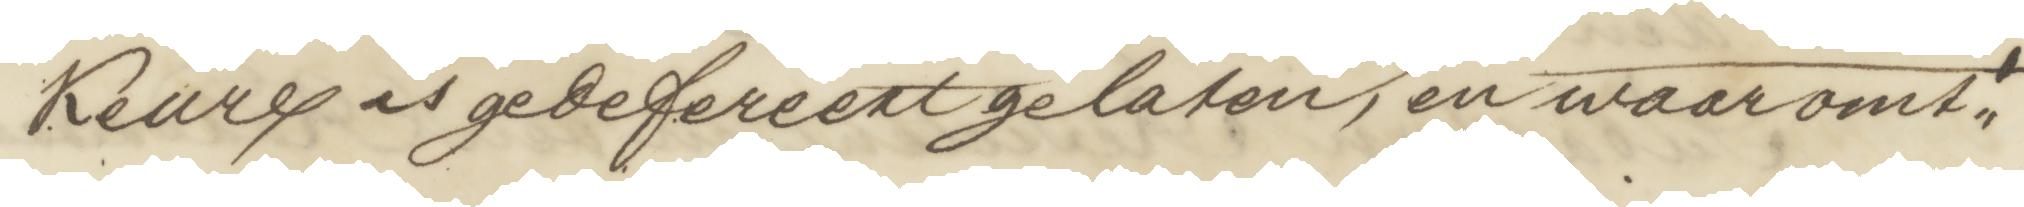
keure is gedefereert gelaten, en waar omt„t
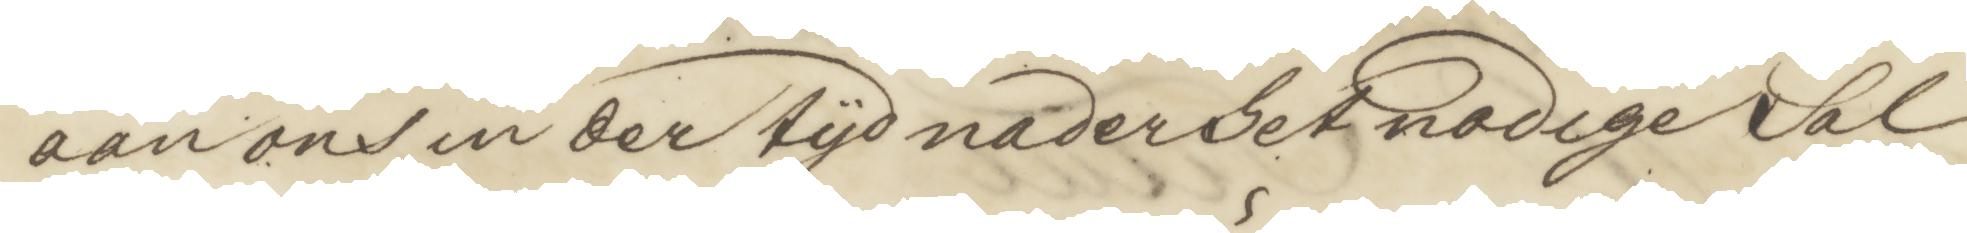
aan ons in der tijd nader het nodige sal
